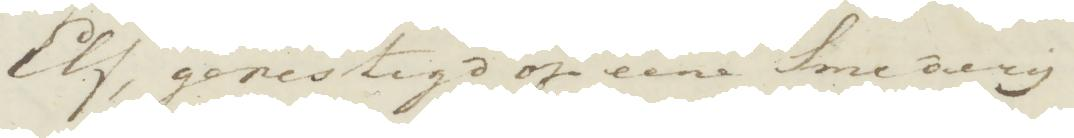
Elf, gevestigd op eene Sme derij
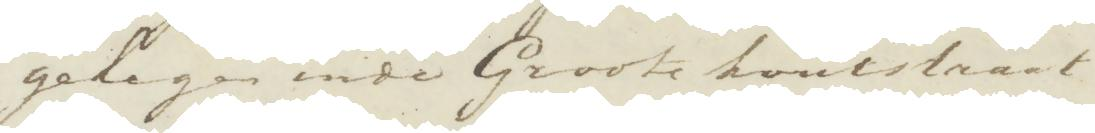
gelegen inde Groote houtstraat
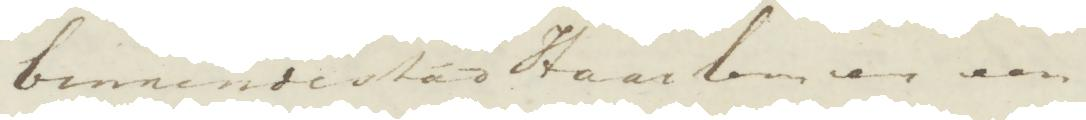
binnen de stad Haarlem en een
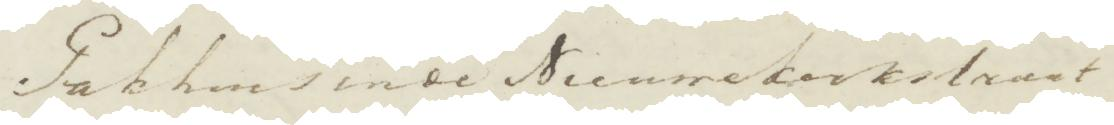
Pakhuis en de Nieuwekerkstraat
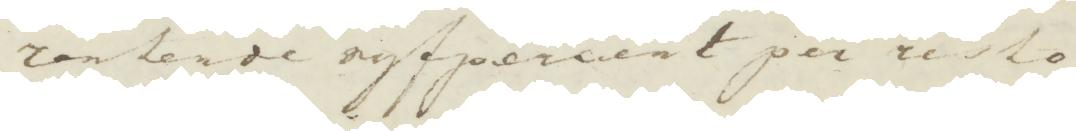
rentende vyf percent per resto
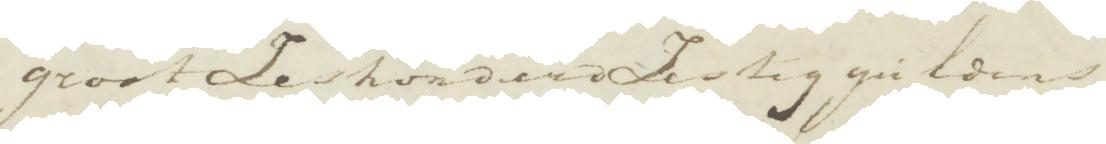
groot Zeshonderd Zestig guldens,
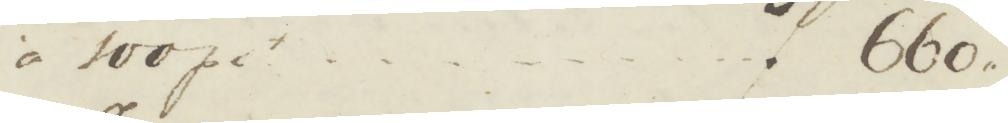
à 100 pc:t . . . . . . . . . ƒ 660„
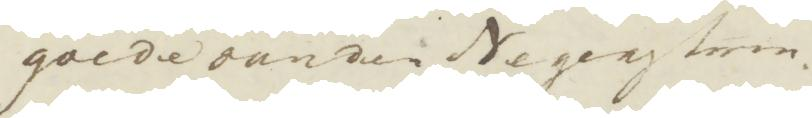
goede aan den Negenen twin
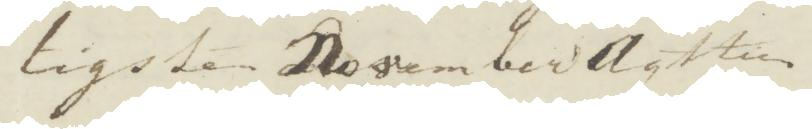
tigsten November Agttien
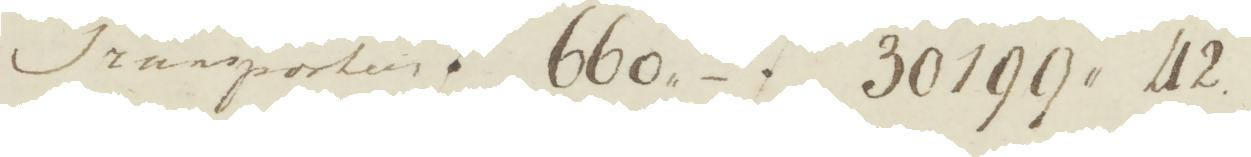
Transporteren ƒ 660„ - ƒ 30199„ 42
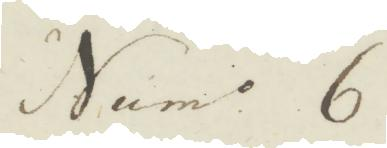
Num.o 6
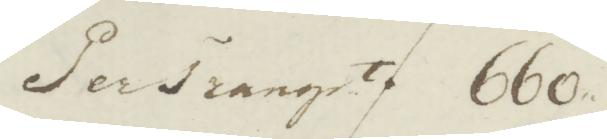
Per Transp„t ƒ 660„ -
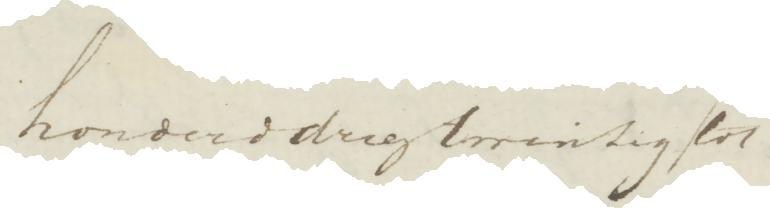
honderd drieen twintig tot
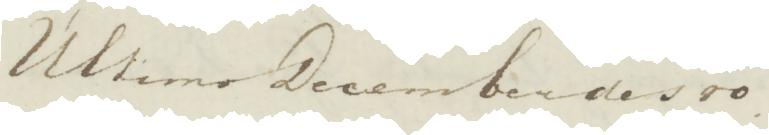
Ultimo December des vo.
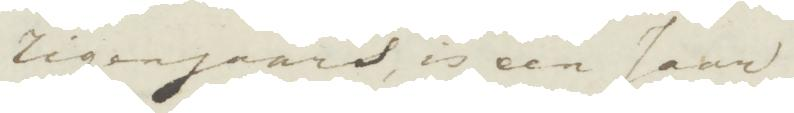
rigen jaars, is een Jaar
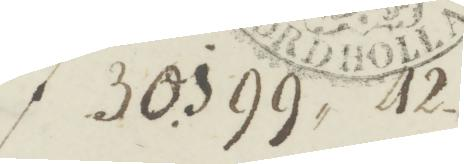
ƒ 30199„ 42-
